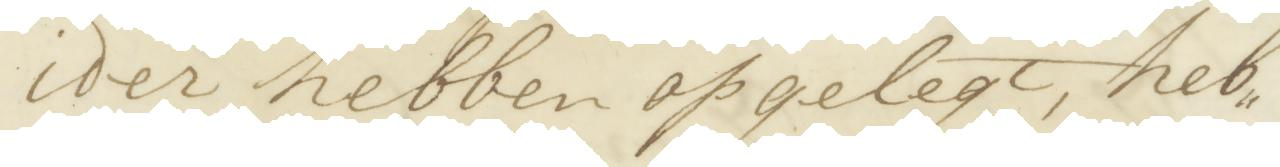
ider hebben opgelegt, heb„
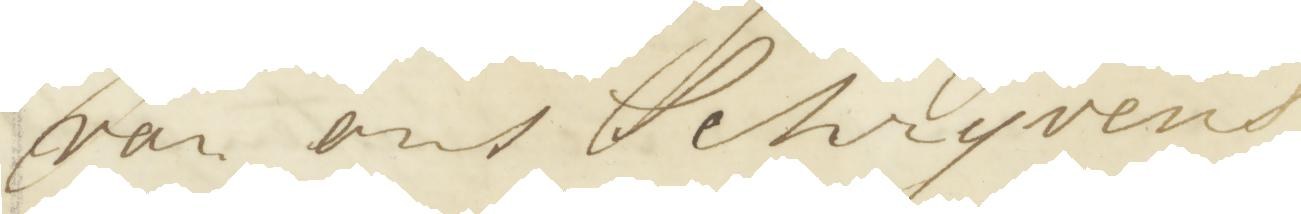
van ons schryvens
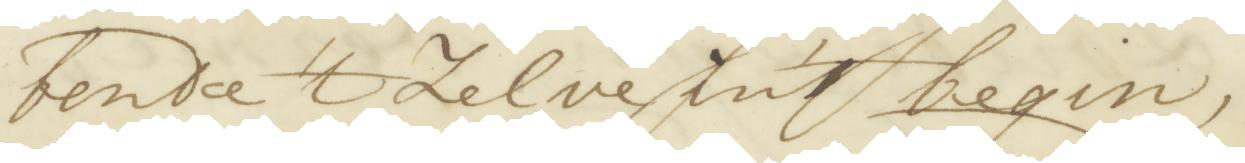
bende ’t zelve in't begin,
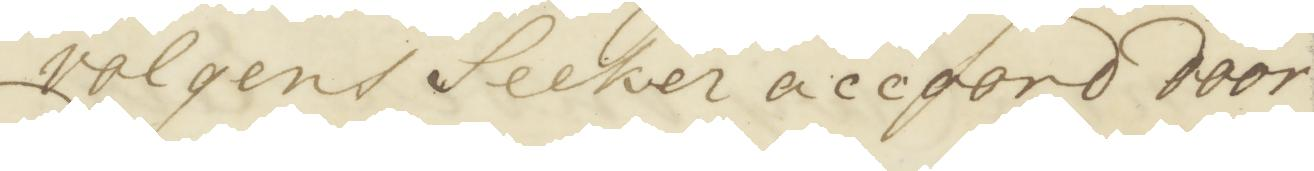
volgens seeker accoord door
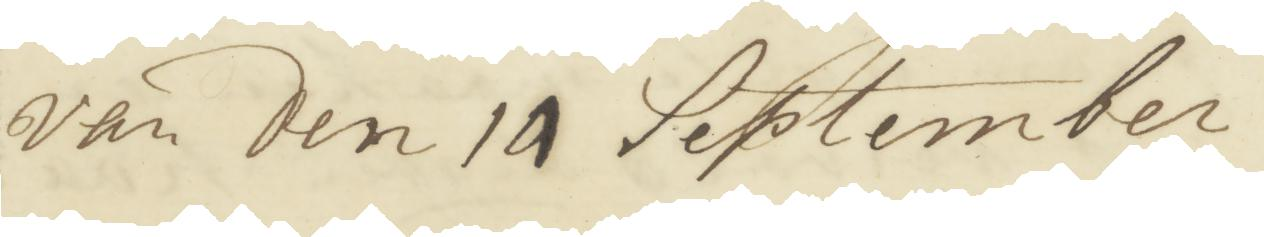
van den 14 september
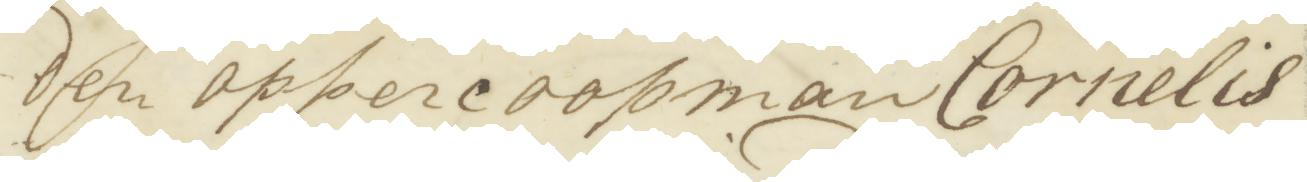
den oppercoopman Cornelis
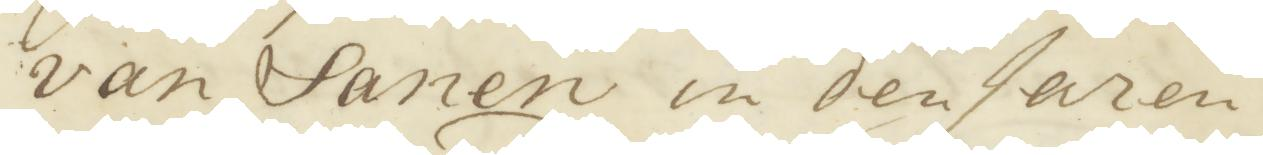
van Sanen in den Jaren
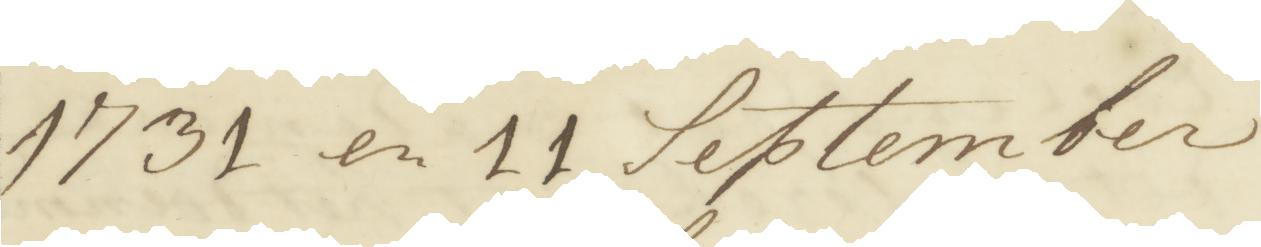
1731 en 11 september
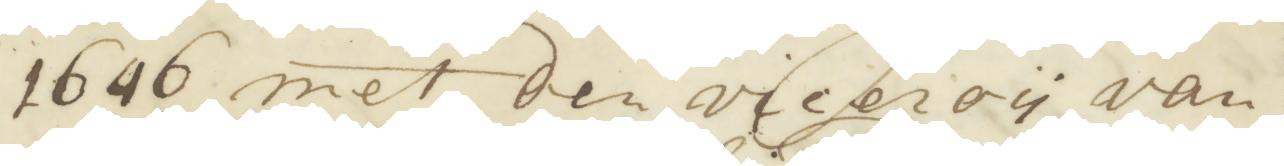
1646 met den viceroij van
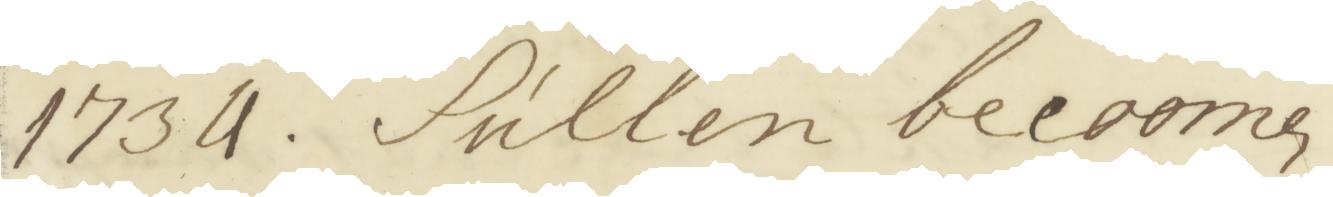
1734. sullen becoomen
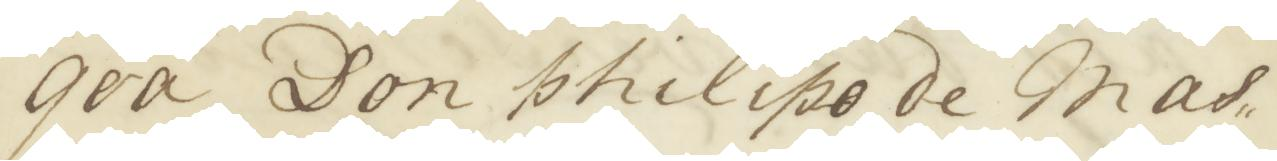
goa Don philipo de Mas„
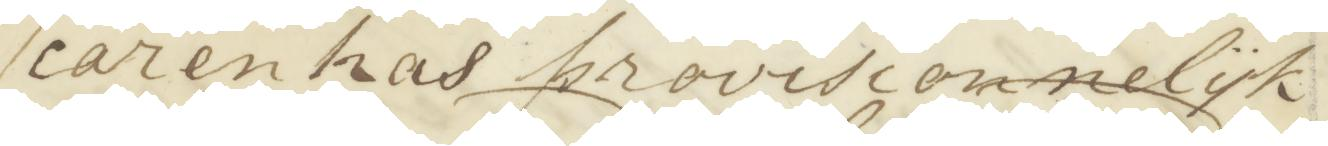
carenhas provisionnelijk
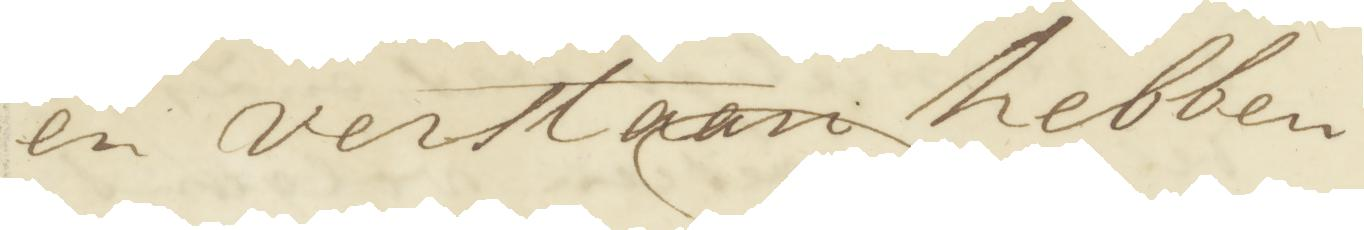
en verstaan hebben
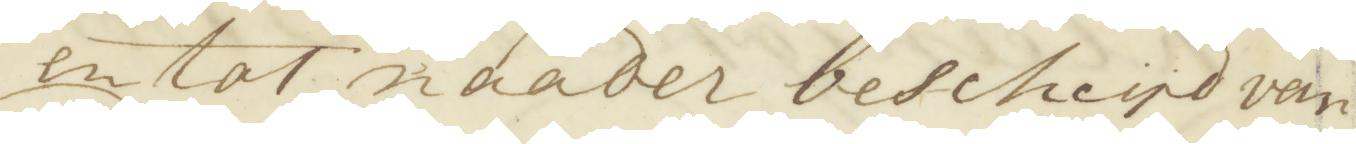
en tot naader bescheijd van
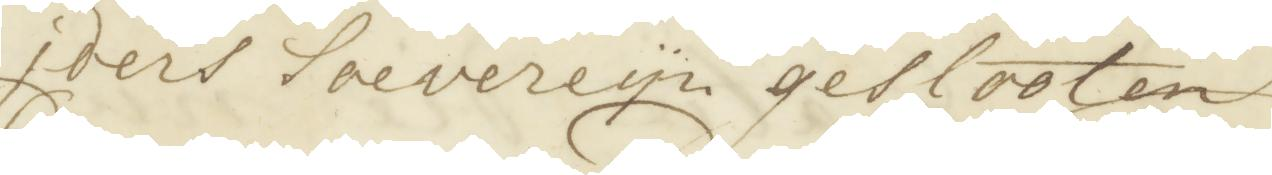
jders soevereijn geslooten
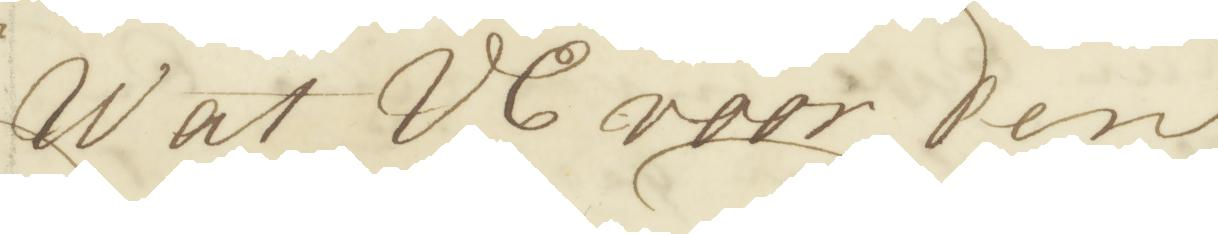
wat UE voor den
